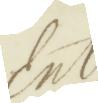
1 Entr
